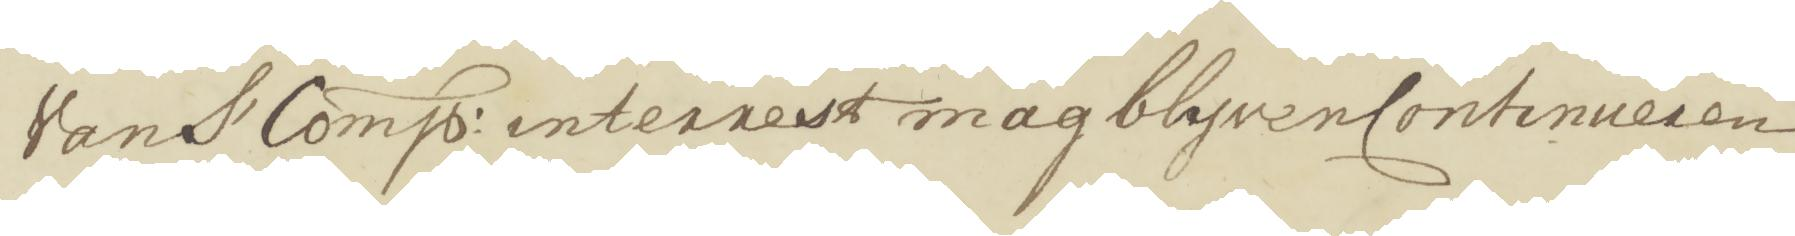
van s' Comp: interrest mag blyven Continueren
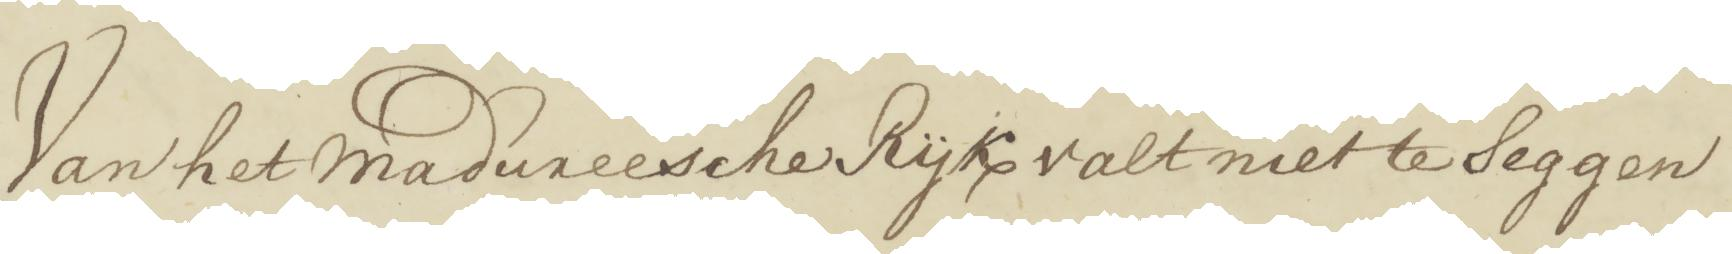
Van het madureesche Rijk valt niet te seggen
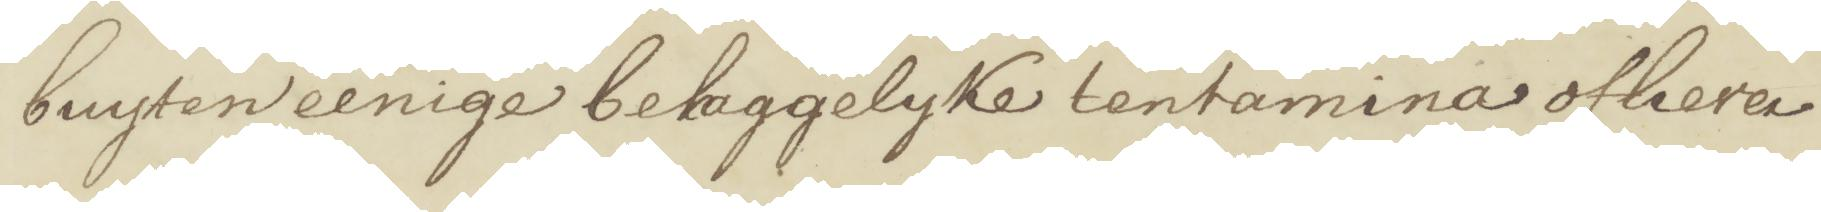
buyten eenige belaggelyke tentamina of liever
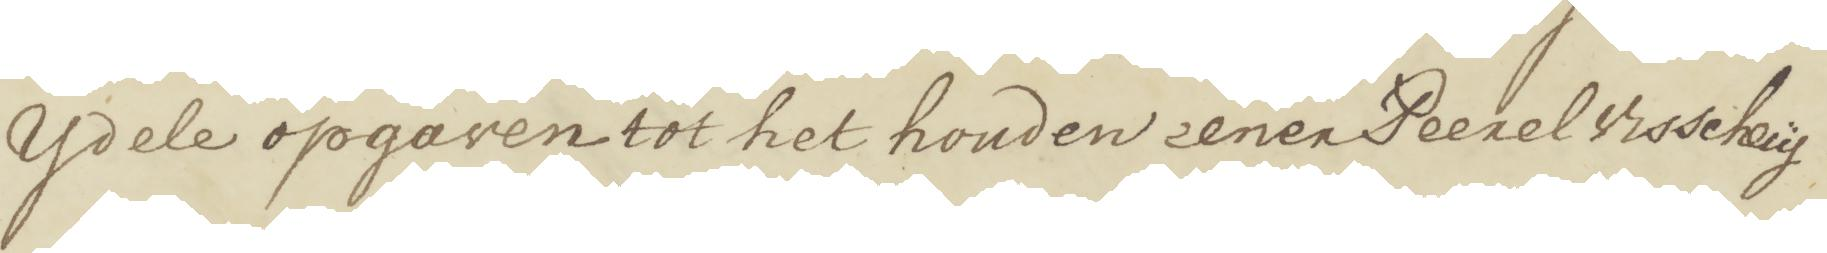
Ydele opgaven tot het houden eener Peerel visscherij
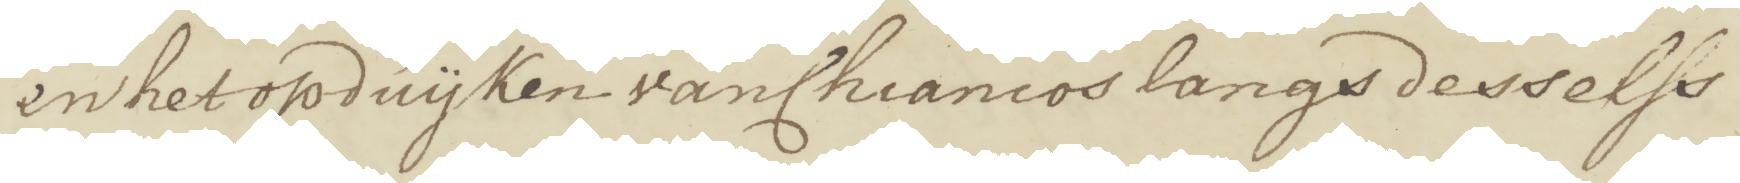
en het opduijken van Chianios langs desselfs
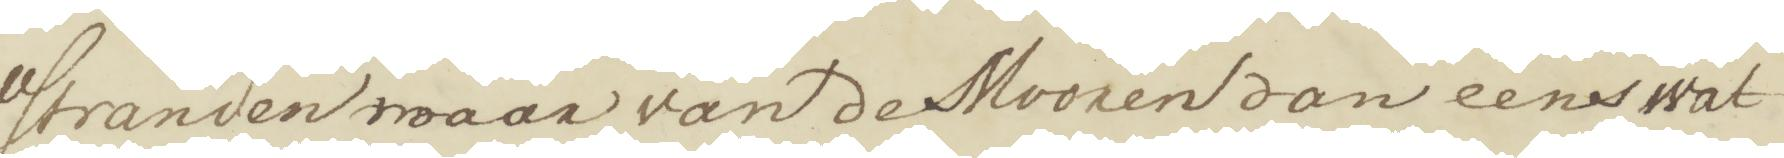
stranden waar van de Mooren dan eens wat
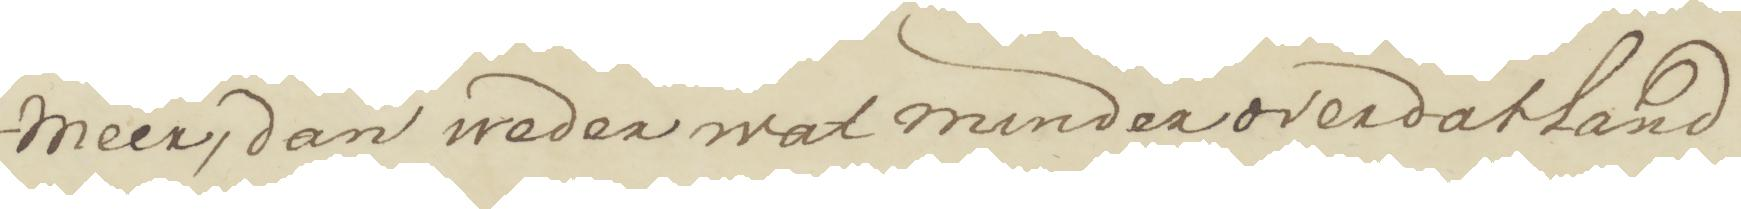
meer, dan weder wat minder over dat land
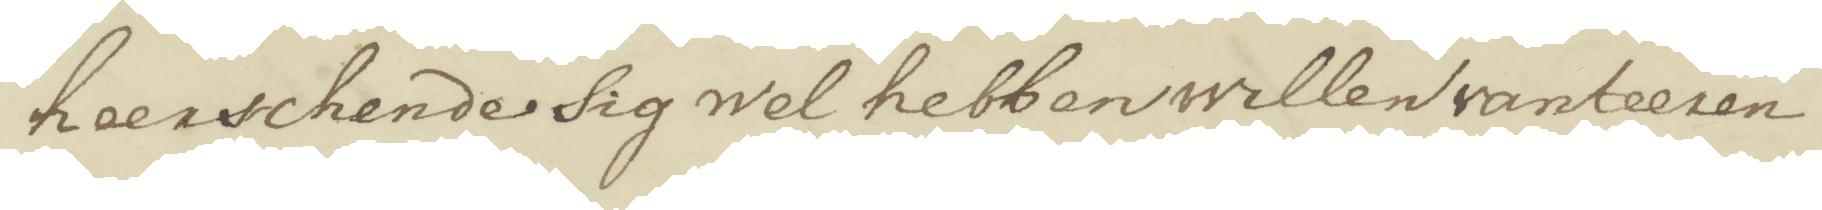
heerschende sig wel hebben willen vanteeren
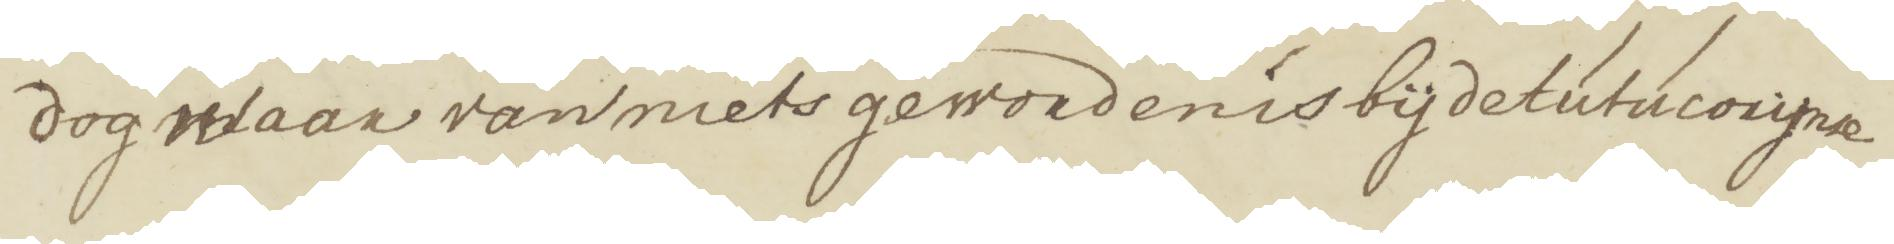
dog waar van niets geworden is bij detutucorijnse
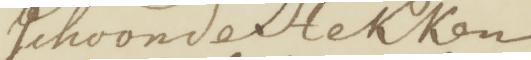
schoonde Hekken
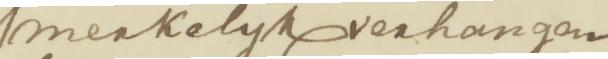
merkelijk verhangen
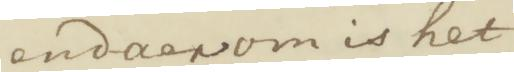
en daerom is het
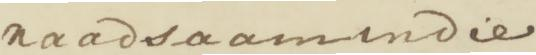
raadsaam in die
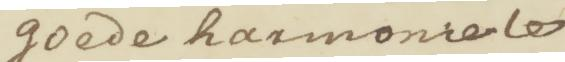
goede harmonie te
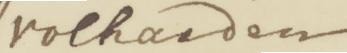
volharden
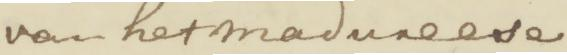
van het madureese
